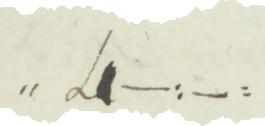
„ 4 —: —:
